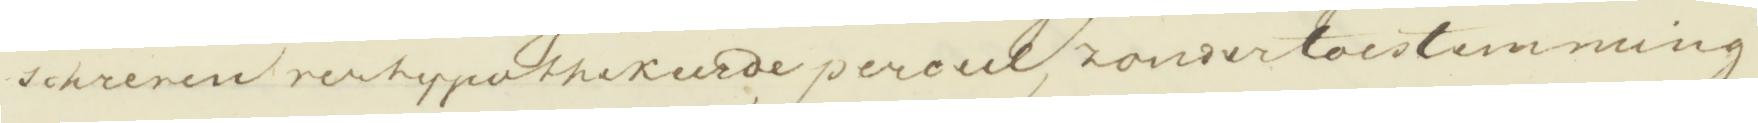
schreven verhypothekeerde perceel, zondertoestemming
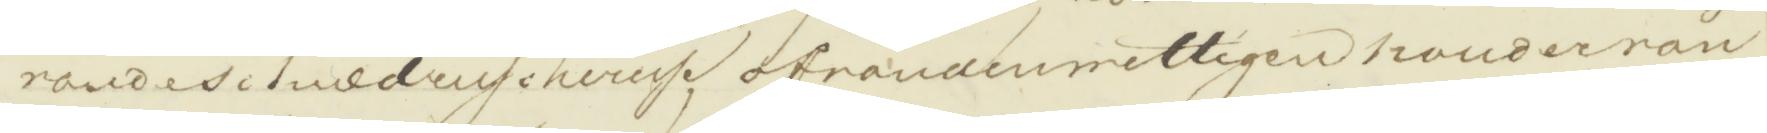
van de schuldeisscheresse, ofvandenwettigen houdervan
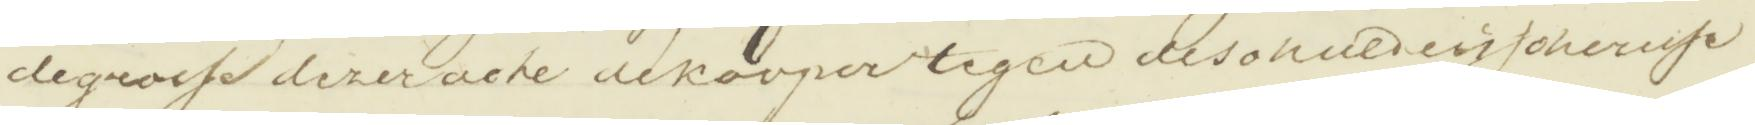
de grosse dezer acte dekooper tegen deschuldeisscheresse
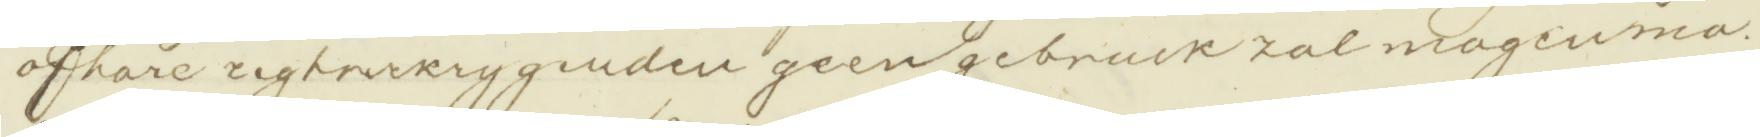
ofhare regtverkrygenden geen gebruik zal mogen ma.
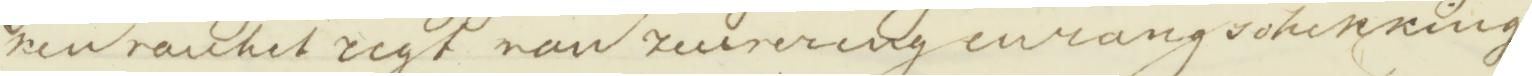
ken vanhet regt van zuivering enrangschikking
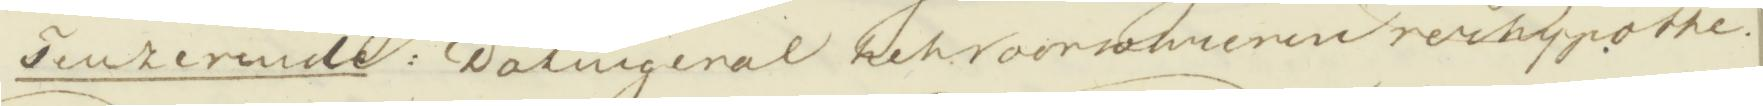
Tenzevende : Datingeval hetvoorschreven verhypothe.
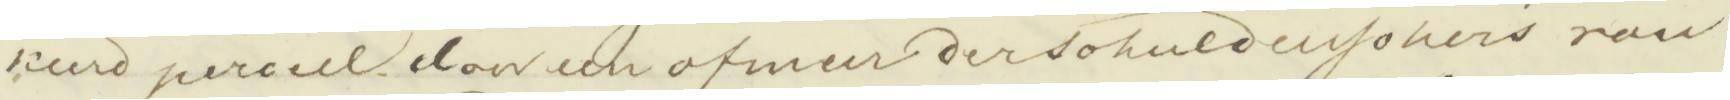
keerd perceel door een ofmeer derschuldeisschers van
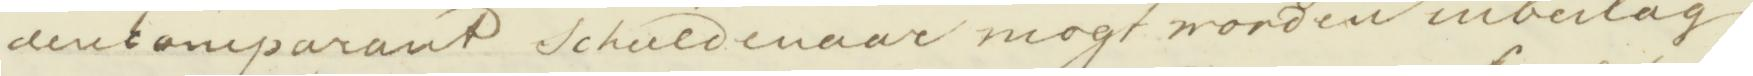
dencomparant schuldenaar mogt worden inbeslag
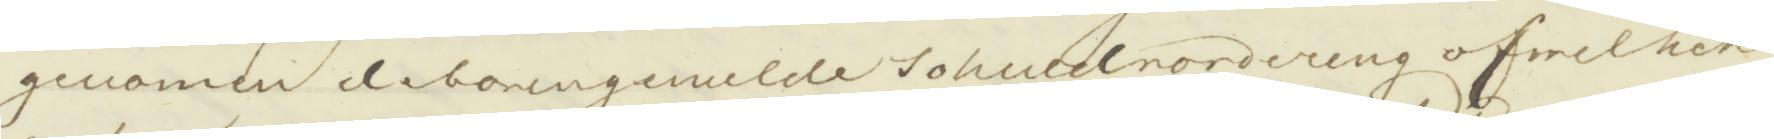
genomen debovengemelde schuldvordering ofwelhet
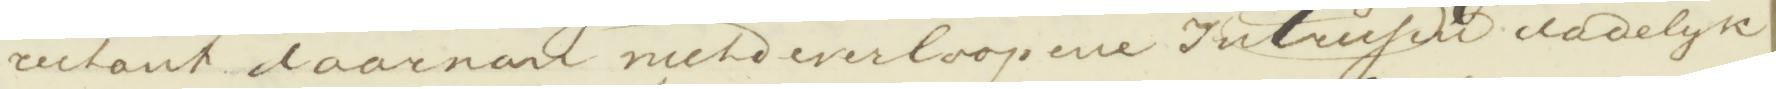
restant daarvan metdeverloopene Intressen dadelyk
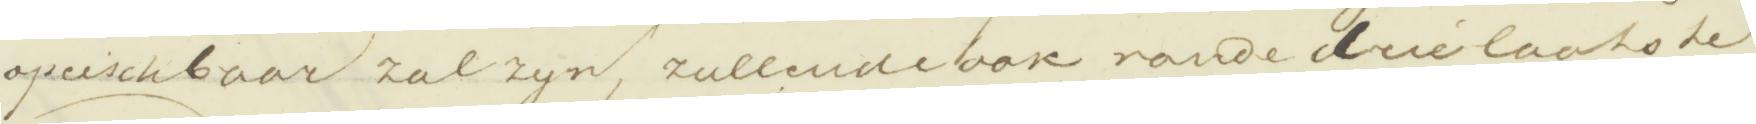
opeischbaar zal zyn, zullende ook vande drie laatste
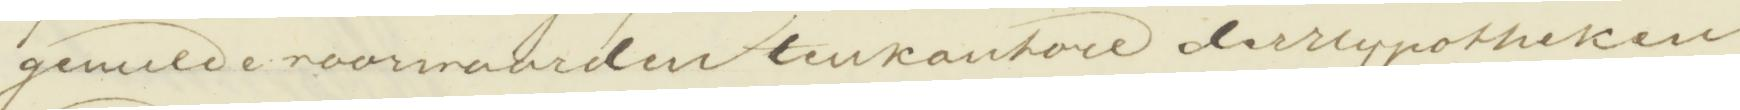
gemelde voorwaarden tenkantore derHypotheken
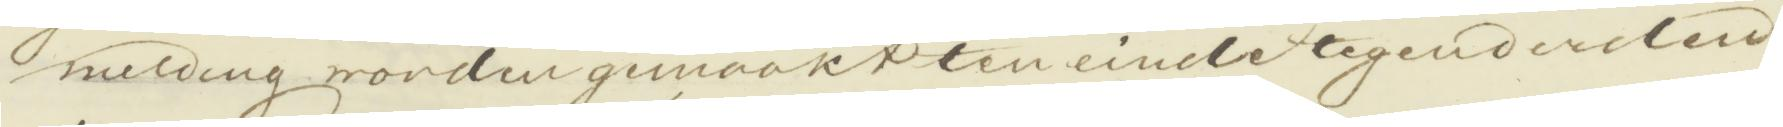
melding worden gemaakt ten einde tegenderden
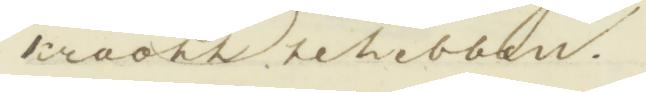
kracht tehebben.
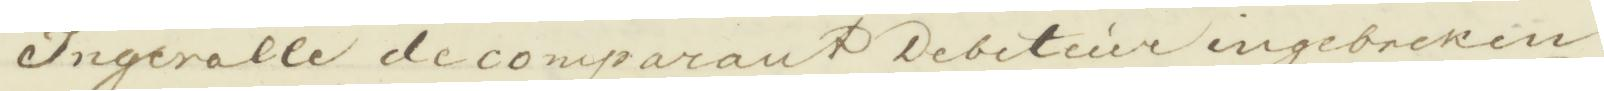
Ingevalle de comparant Debiteur ingebreken
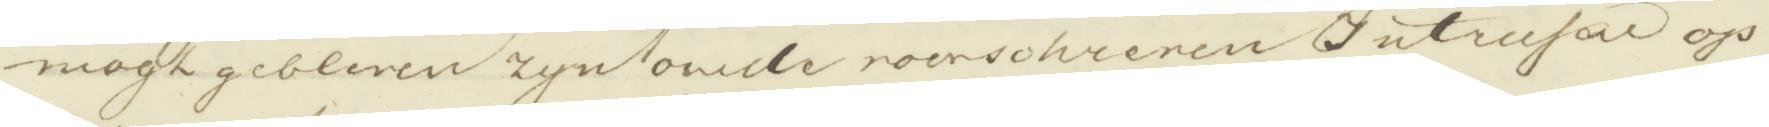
mogt gebleven zyn omde voorschreven Intressen op
